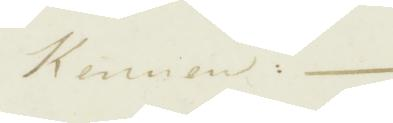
kennen:—
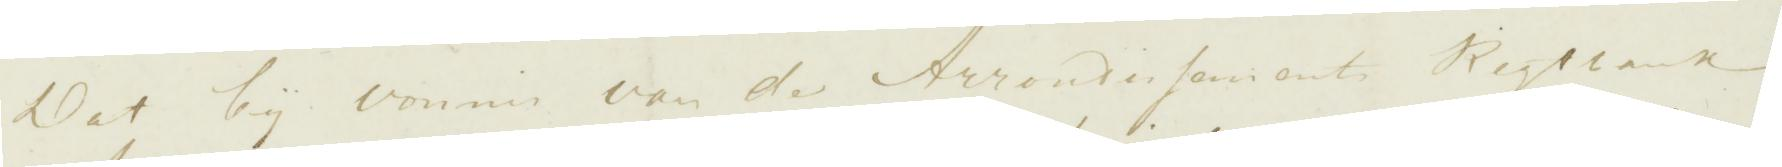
Dat bij vonnis van de Arrondissement Regtbank
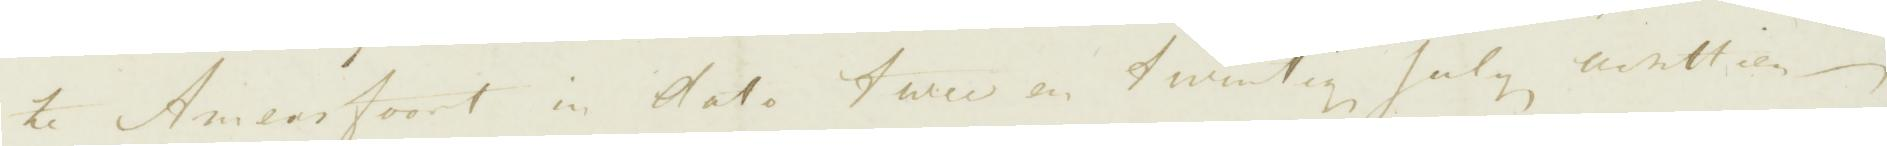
te Amersfoort in dato twee en twintig July achttien
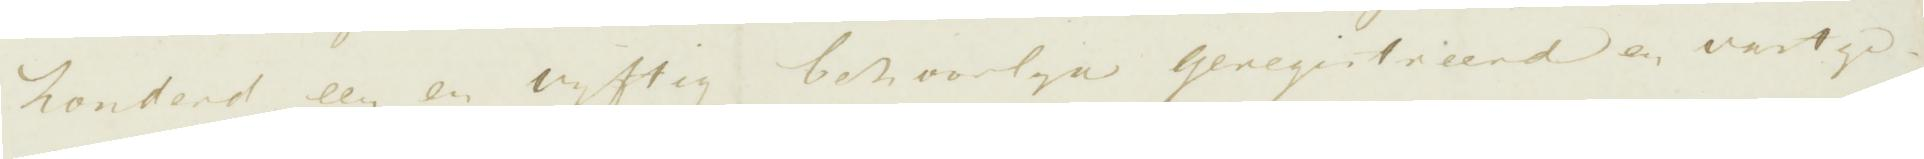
honderd een en vyftig behoorlyk geregistreerd en vastge-
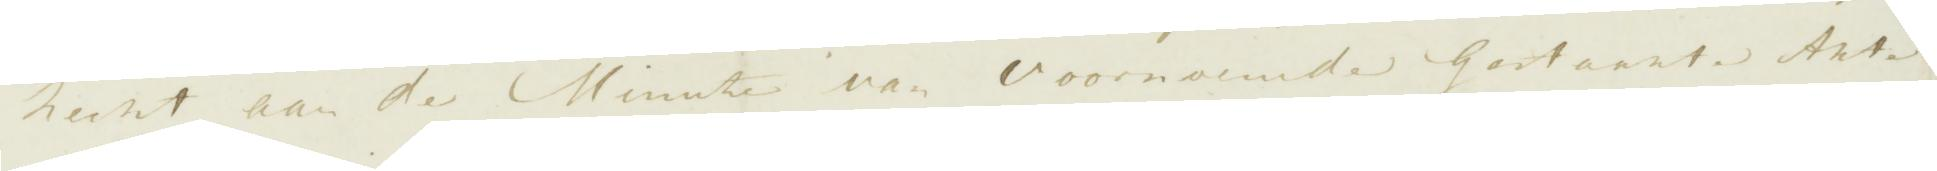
hecht aan de Minute van voornoemde Gestaakte Akte
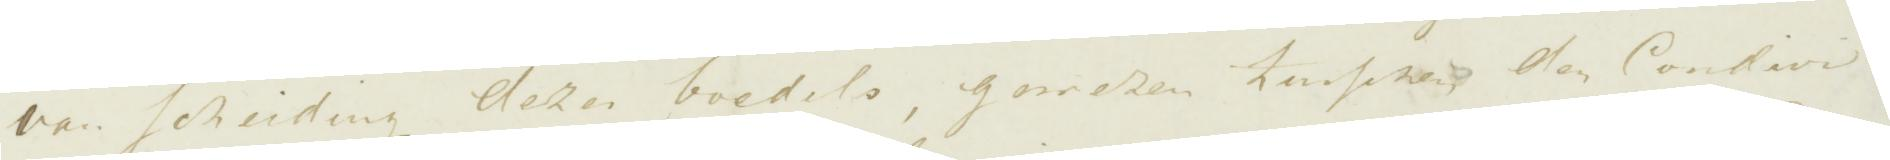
van scheiding dezes boedels, gewezen tusschen den Condivi
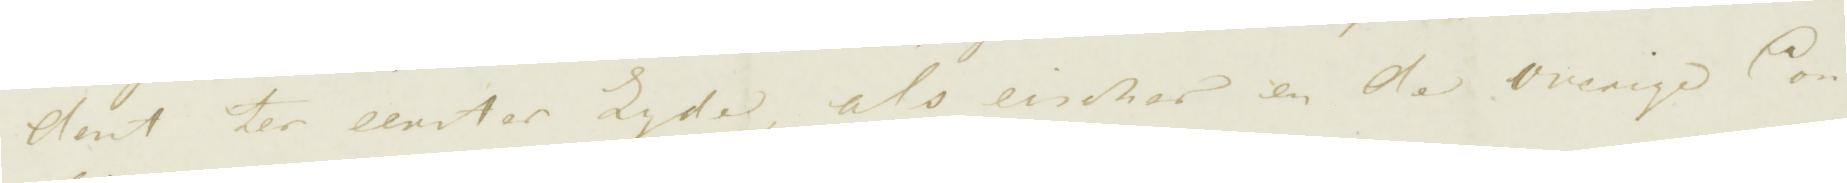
dent ter eerster zyde, als eischer en de overige Con
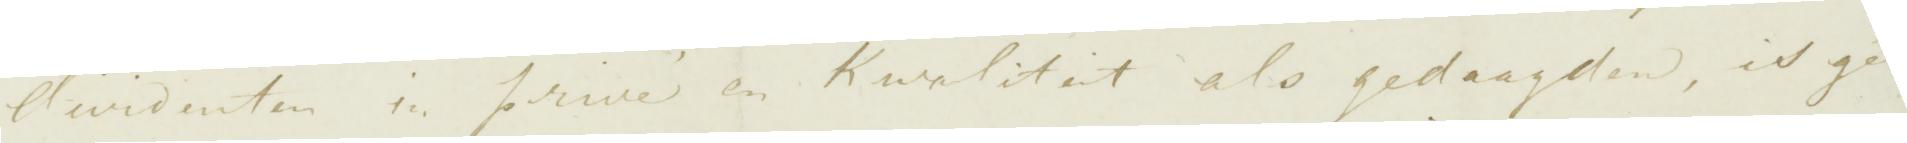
dividenten in privé en kwaliteit als gedaagden, is ge
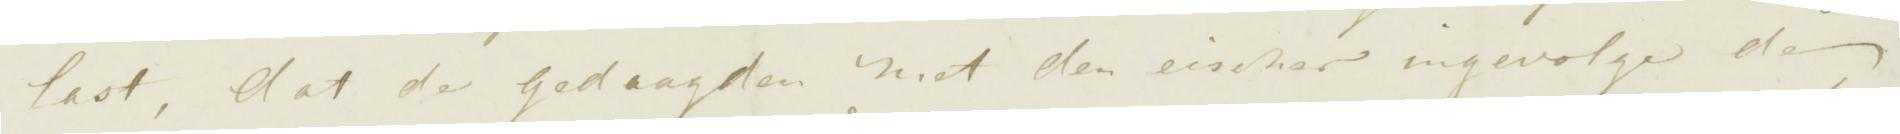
last, dat de gedaagden met den eischer ingevolge de
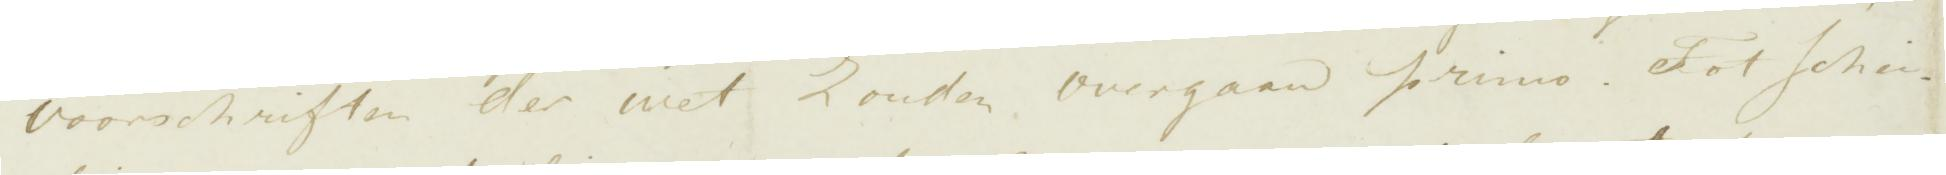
voorschriften der wet zouden, overgaan primo. Tot schei„
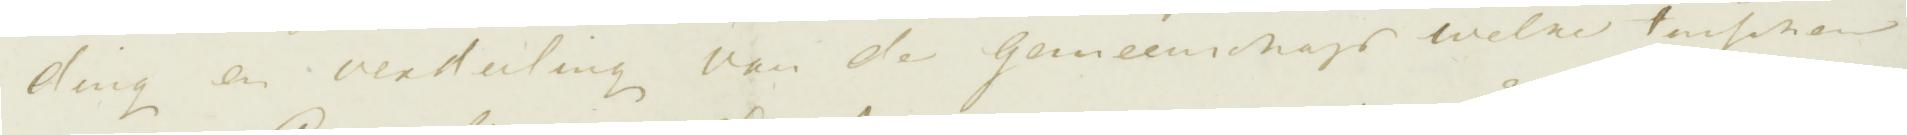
ding en verdeeling van de gemeenschap welke tusschen
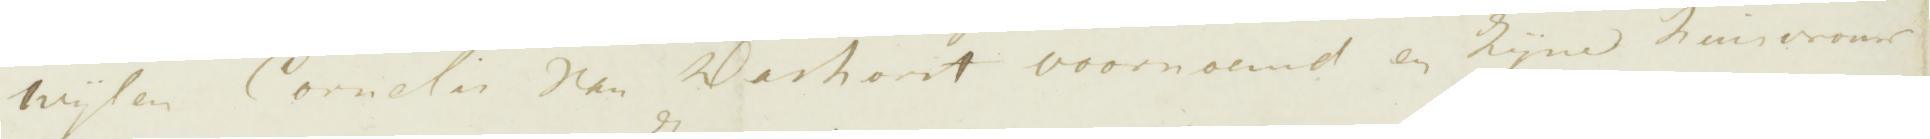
wijlen Cornelis van Dashorst voornoemd en zijne Huisvrouw
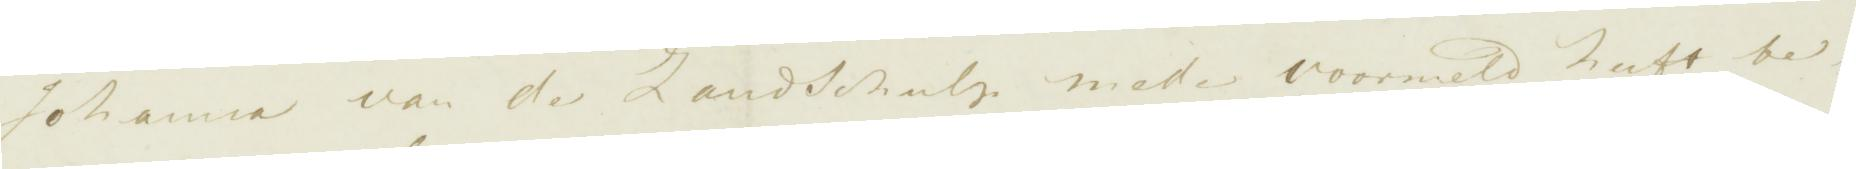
Johanna van de Zandschulp mede voormeld heeft be
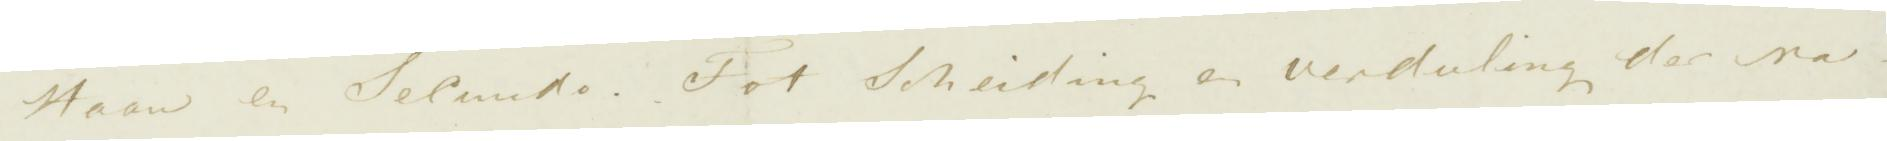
staan en Secunde. Tot scheiding en verdeeling der na
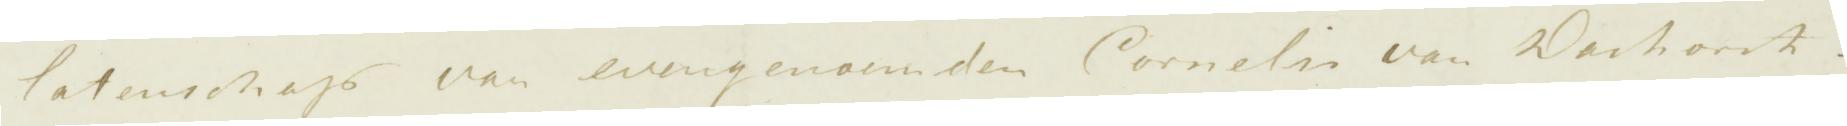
latenschap van evengenoemden Cornelis van Dashorst.
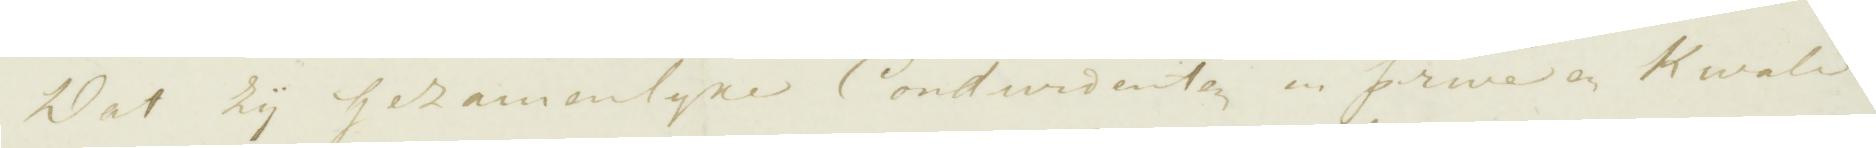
Dat zij gezamenlyke Condividenten in privé en kwali
